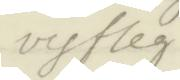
vyfteg
